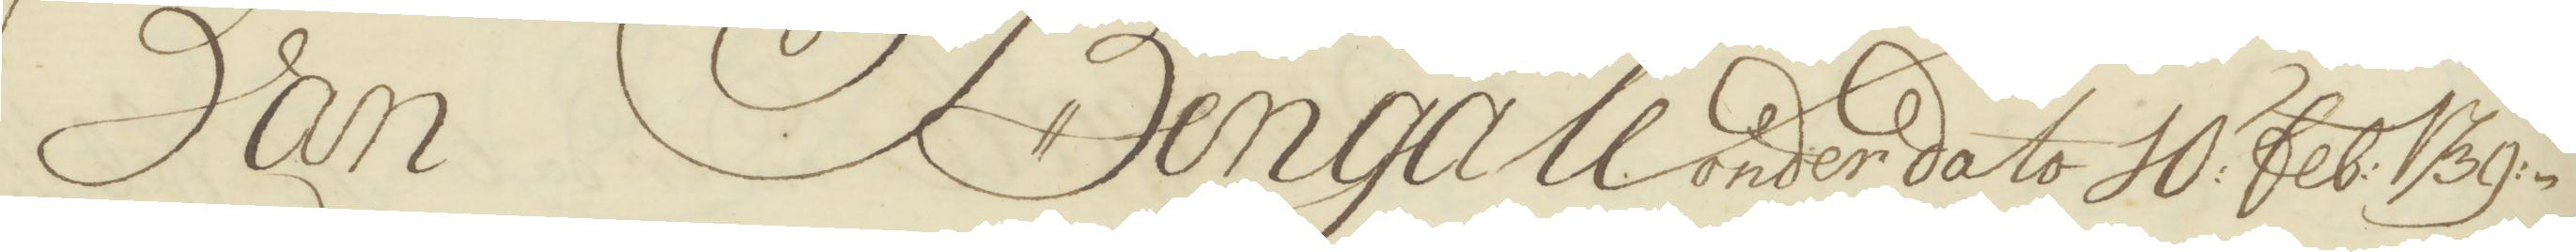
Van Bengale onder dato 10:' feb: 1739:—
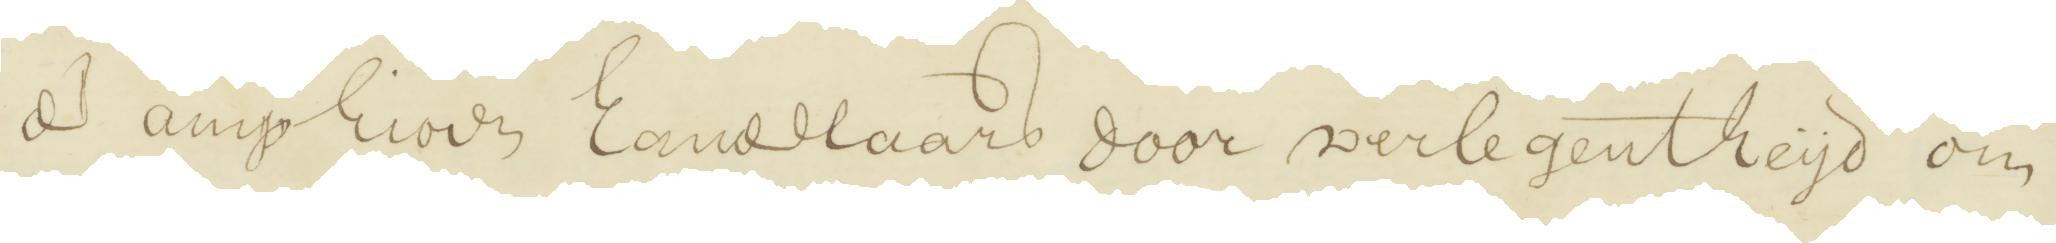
de amphioen handelaars door verlegentheijd om
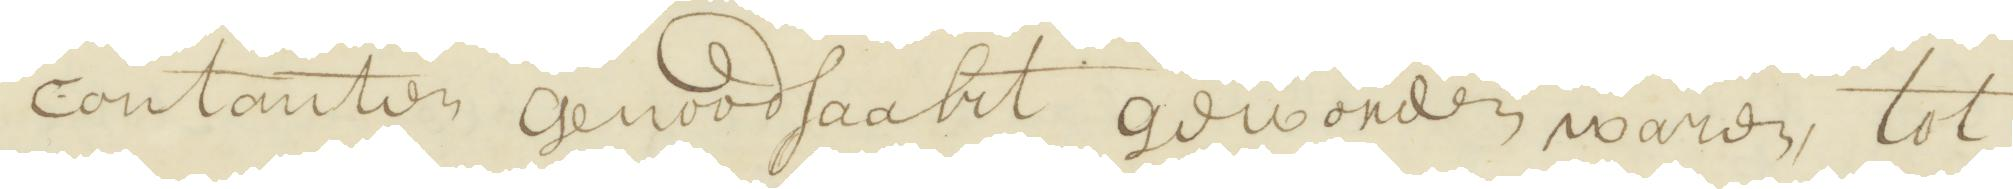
contanten genoodsaakt geworden waren, tot
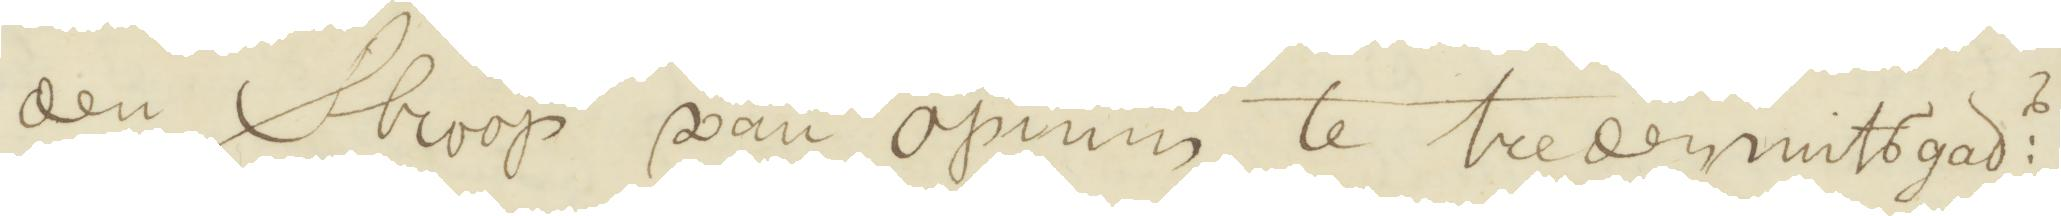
den verkoop van opium te tredenmitsgad:s
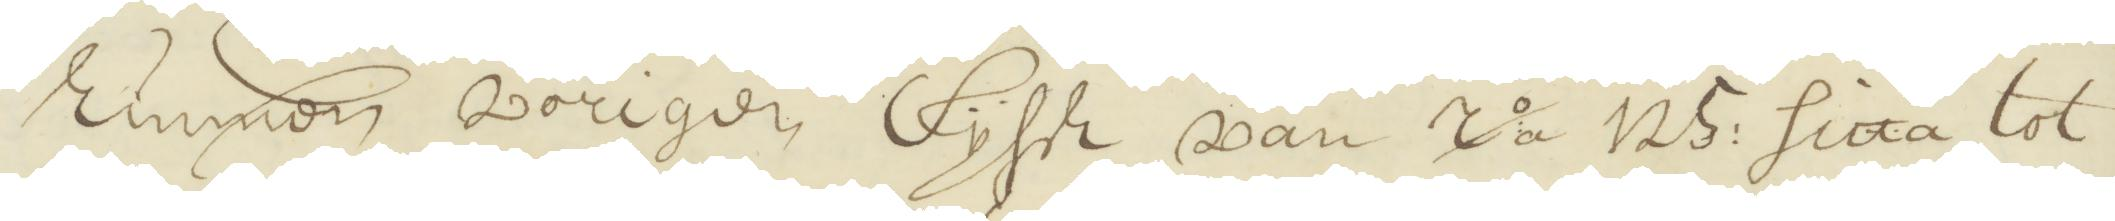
hunnen vorigen Eijsch van ro/:a 125: sicca tot
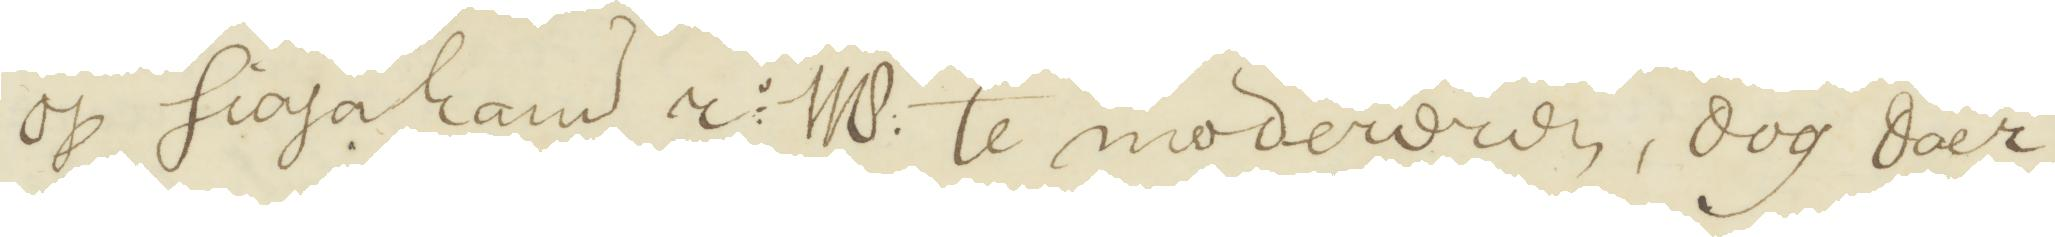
op siajahane r:o 118: te modereren, dog daer
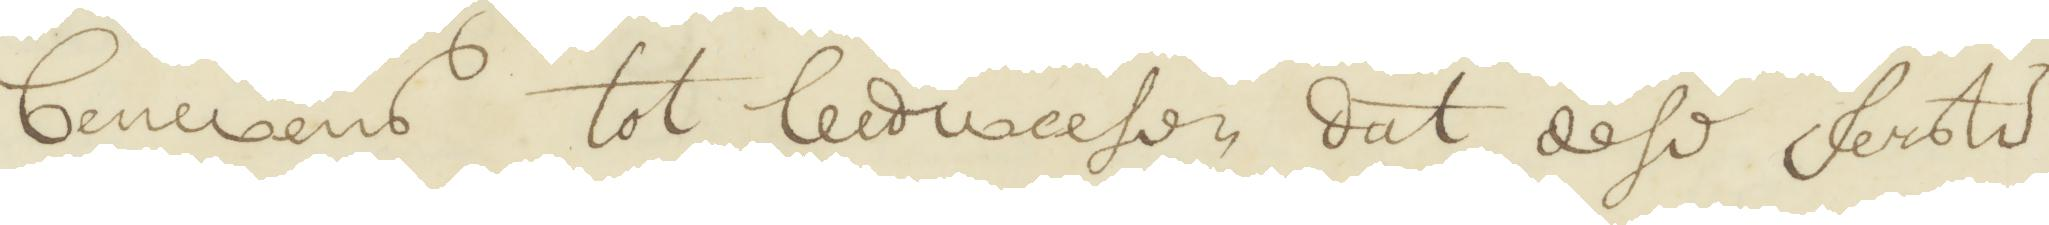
benevens tot leedweesen dat dese eerste
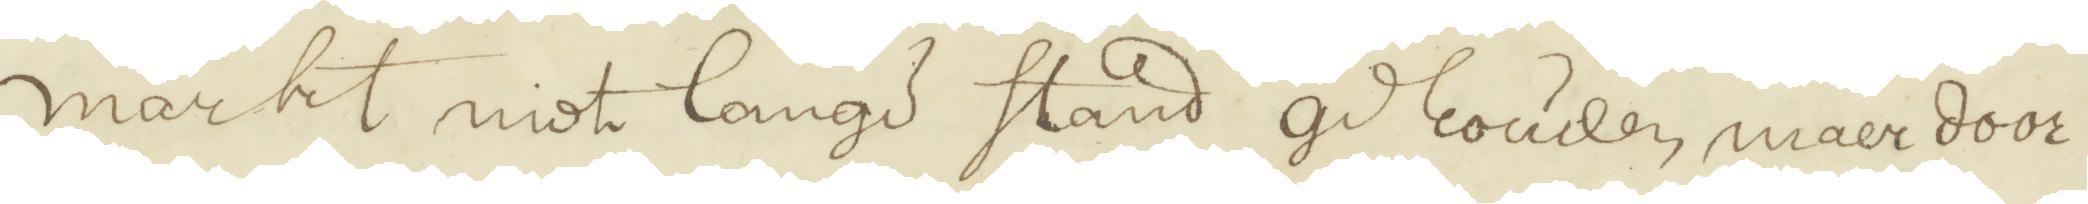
markt niet lange stand gehouden maer door
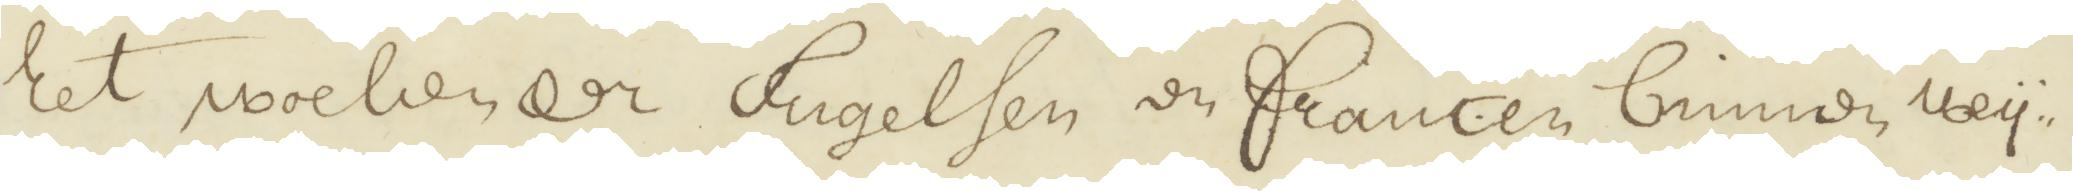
het woelen der engelsen en francen binnen weij„
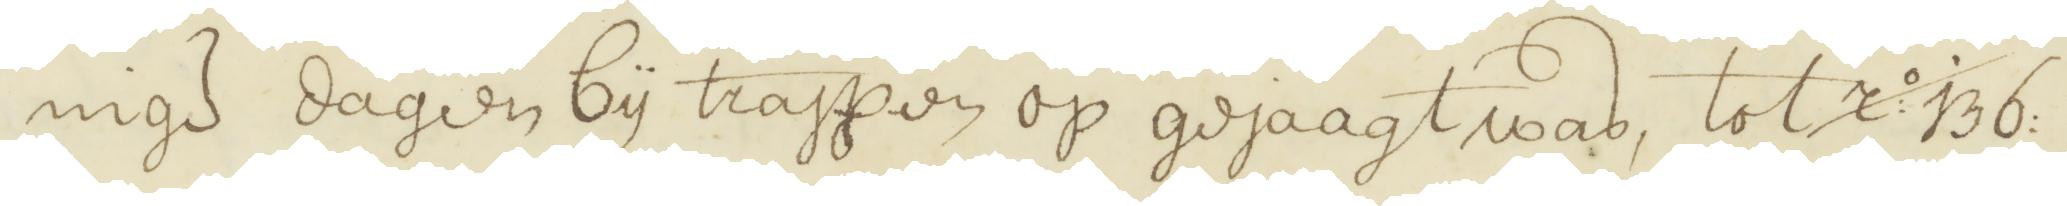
nige dagen bij trappen op gejaagt was, tot r/:o 136:
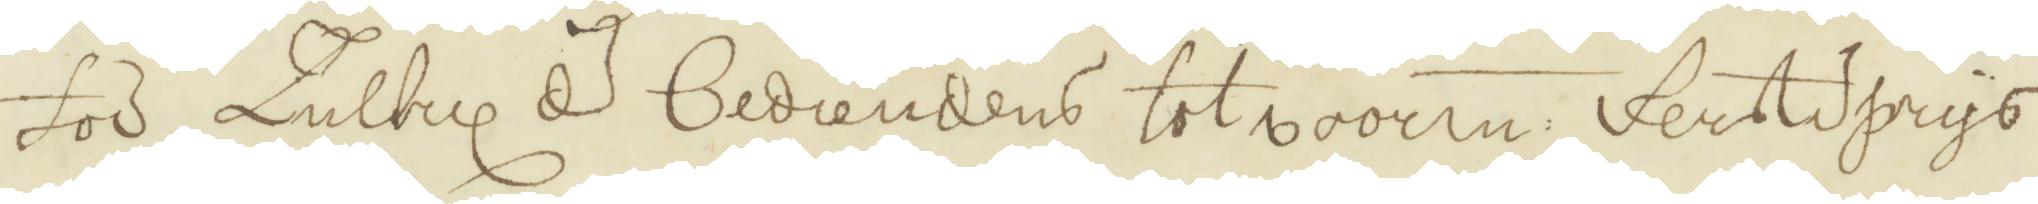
toe zulkx de bediendens tot voorm: eerste prijs
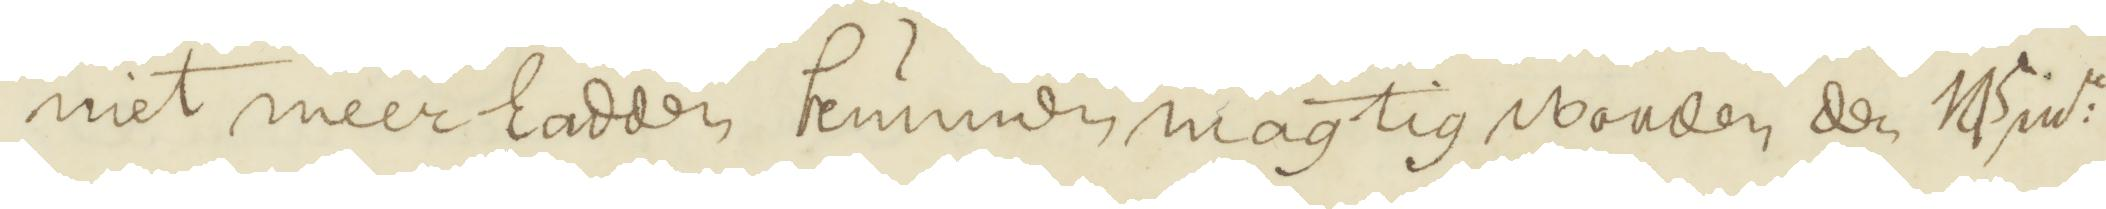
niet meer hadden kunnen magtig worden den 145 in:r
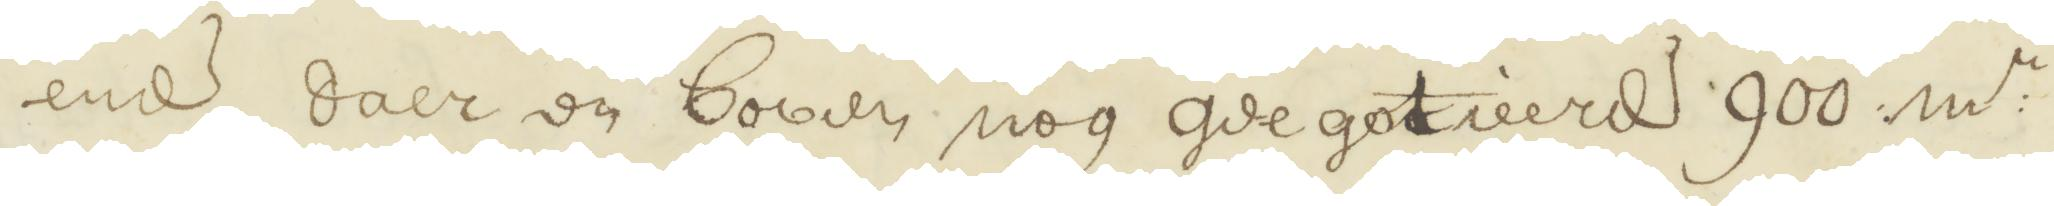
ende daer en boven nog geegotieerd 900: in:r
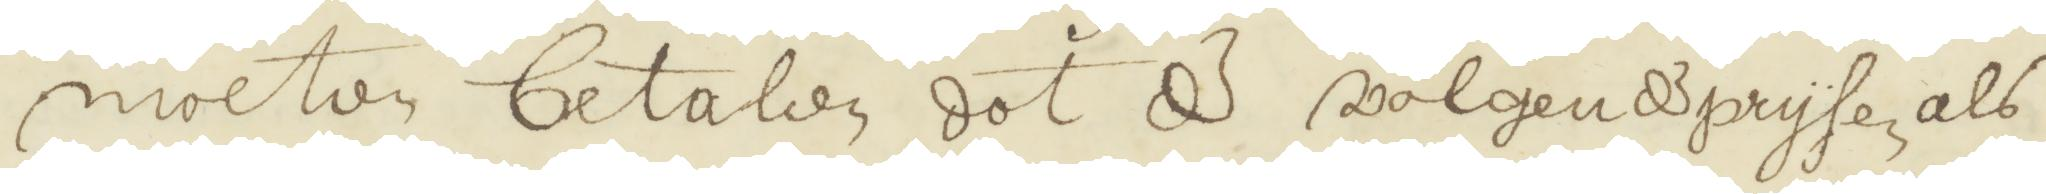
moeten betalen dat de volgende prijsen als
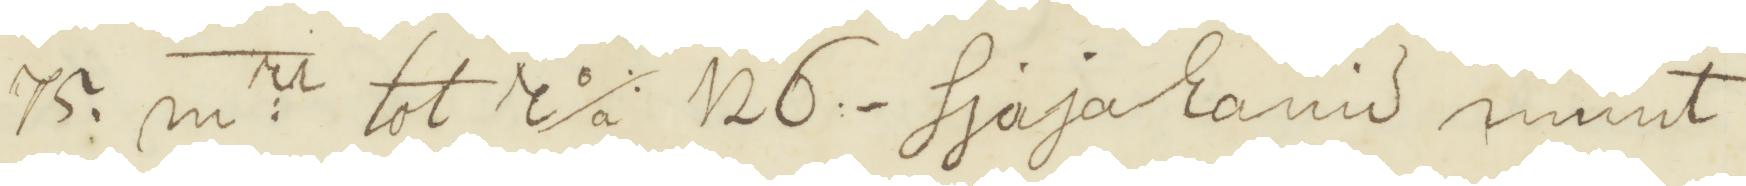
75: m:ri tot ro/a 126:- sjajahanie munt
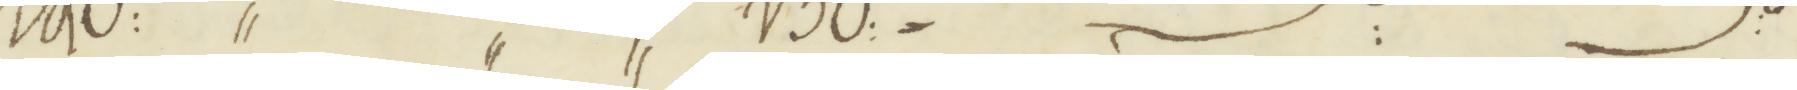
140: „ „ „ 130.= _:o _:o
